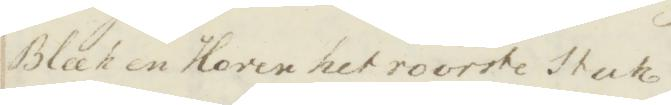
Bleek en Hoven het voorste stuk
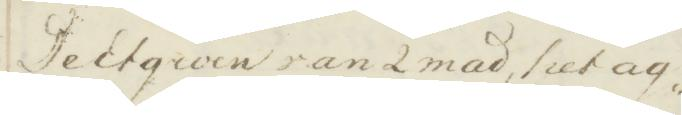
De Etgroen van 2 mad, het ag„
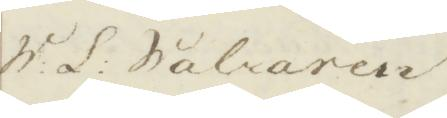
W: L: Walraven
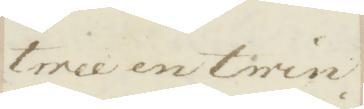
twee en twin„
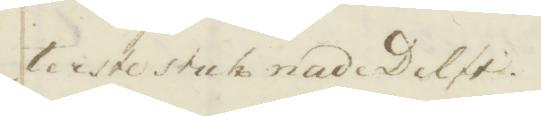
terste stuk nade Delft.
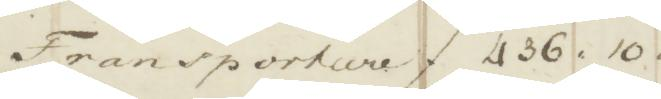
Transporteere ƒ 436 „ 10
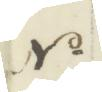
N-o
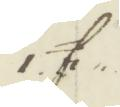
1 ƒ
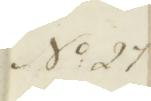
N:o 27
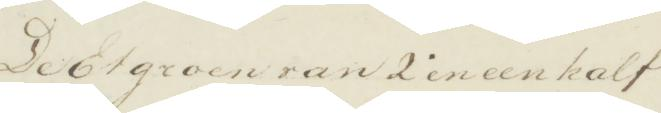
De Etgroen van 2 en een half
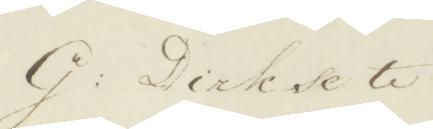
G: Dirkse te
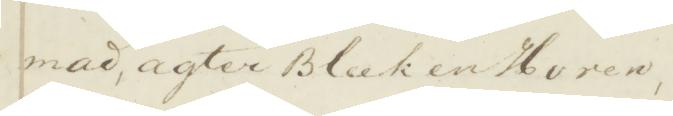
mad, agter Bleek en Hoven,
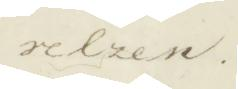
velzen.
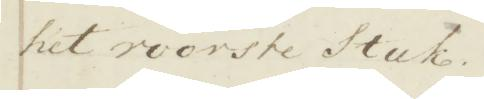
het voorste stuk.
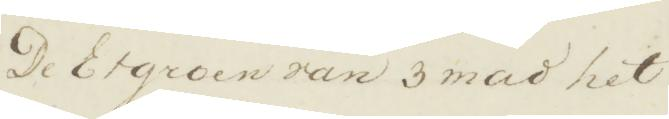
De Etgroen van 3 mad het
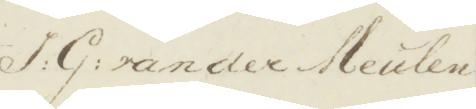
J: G: van der Meulen
